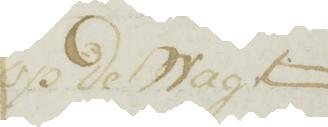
op de wagt
